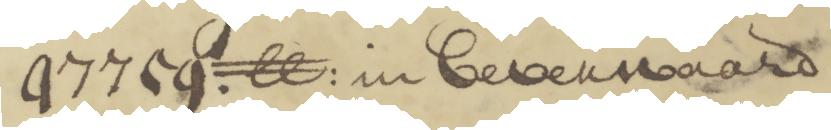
47759: lb: in beverwaard
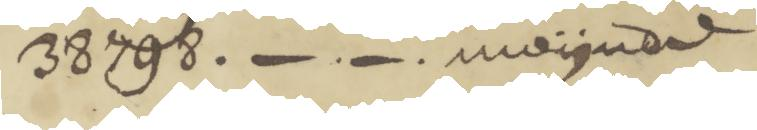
38798.—.—. meijnde
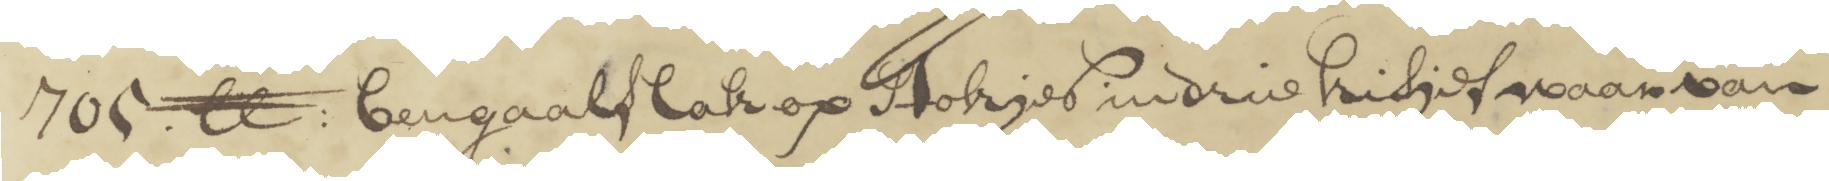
705: lb: bengaals lak op stokjes in drie kisjes waar van
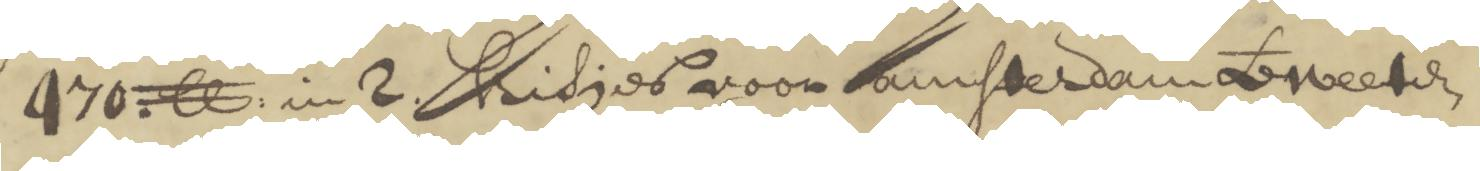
470: lb: in 2. kisjes voor amsterdam te weeten
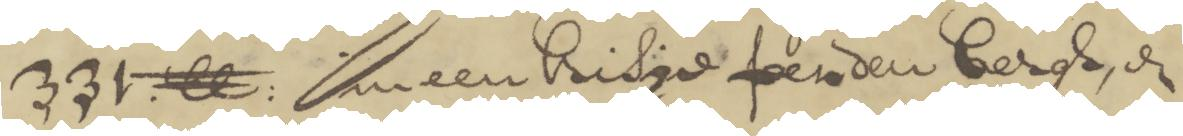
331: lb: in een kisje per den bergh, en
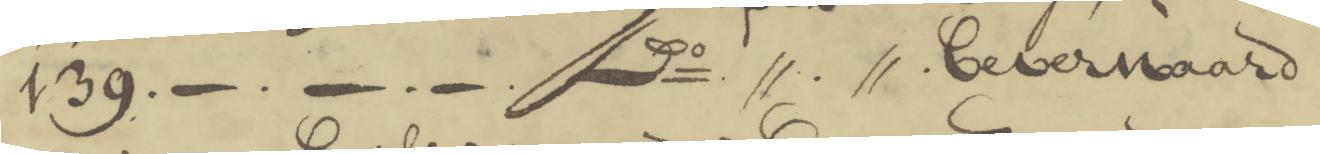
139.—.—.— D=o „.„ beverwaard
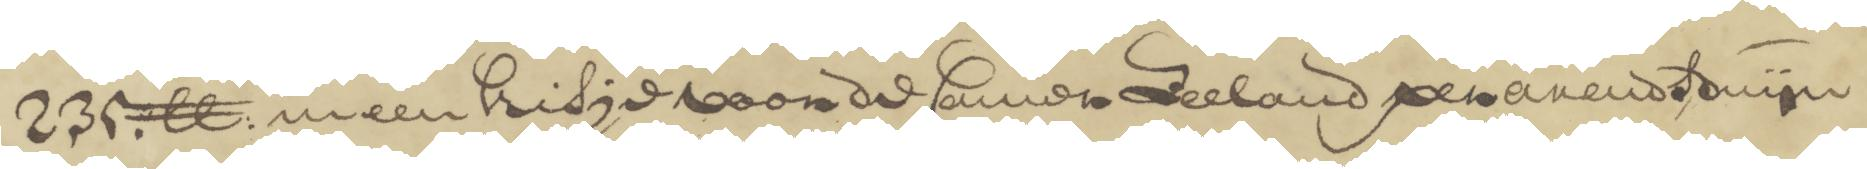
235: lb: in een kisje voor de Camer zeeland per arendsduijn
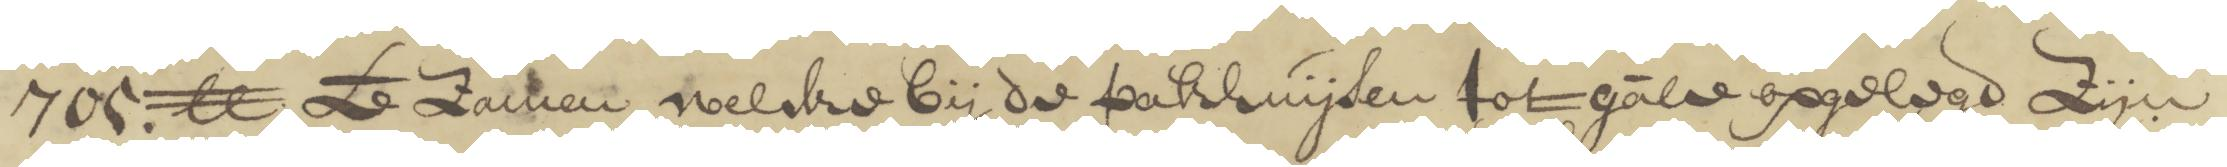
705: lb te zamen, welcke bij de pakhuijsen tot gale opgelegd zijn
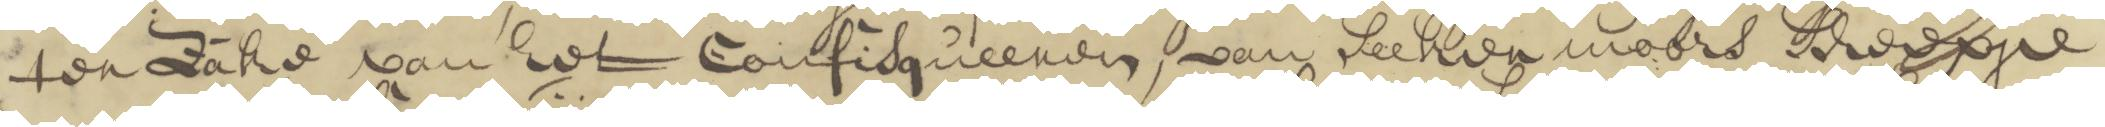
ter zake van het confisqueeren, van seeker moors scheepje
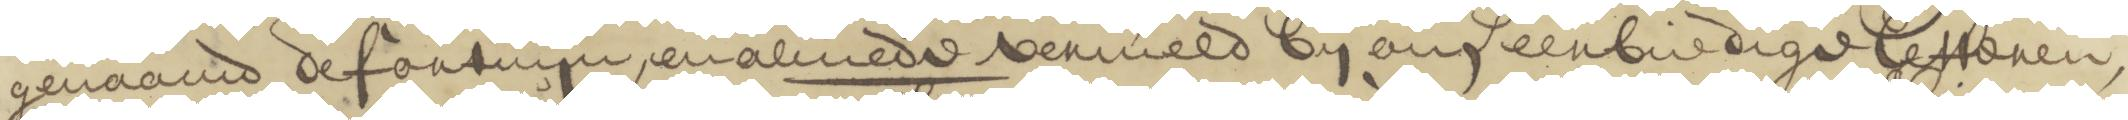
genaamd de fortuijn, en almede vermeld bij ons eerbiedige letteren,
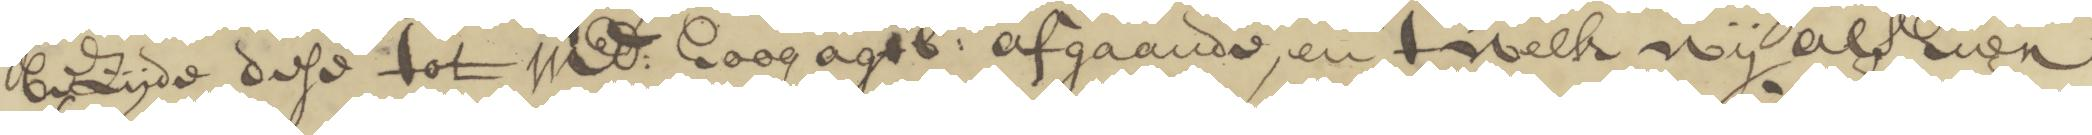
bezijde dese tot UEd: hoog agtb: afgaande, en 'twelk wij als hier
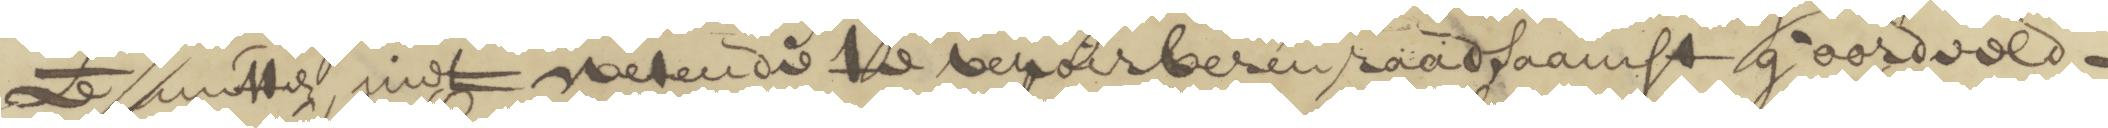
te nutten, niet wetende te veroirberen raadsaamst g’oordeeld
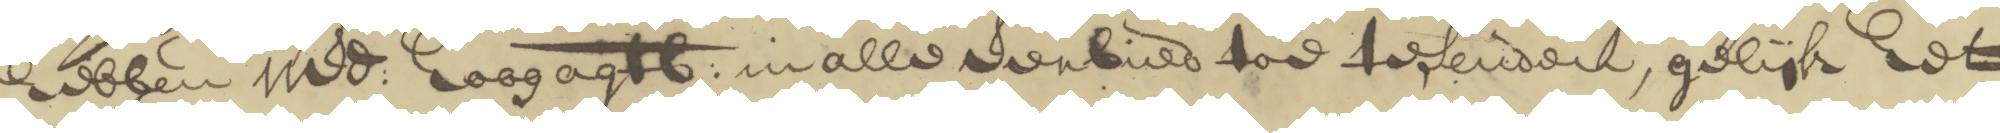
hebben uEd: hoog agtb: in alle Eerbied toe tesenden, gelijk het
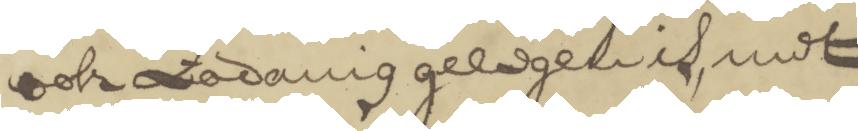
ook zodanig gelegen is, met
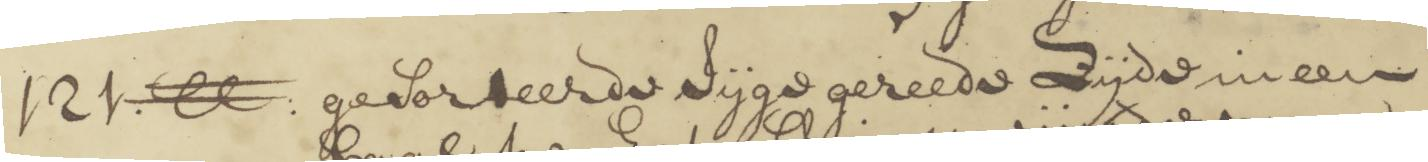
121. lb: gesorteerde Eijge gereede zijde in een
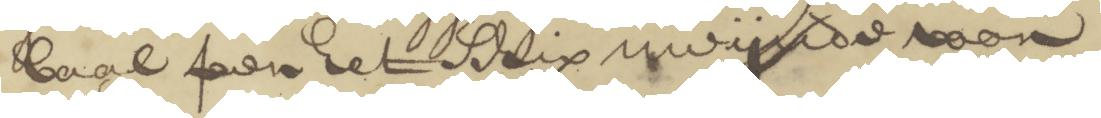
baal per het schip meijnde voor
